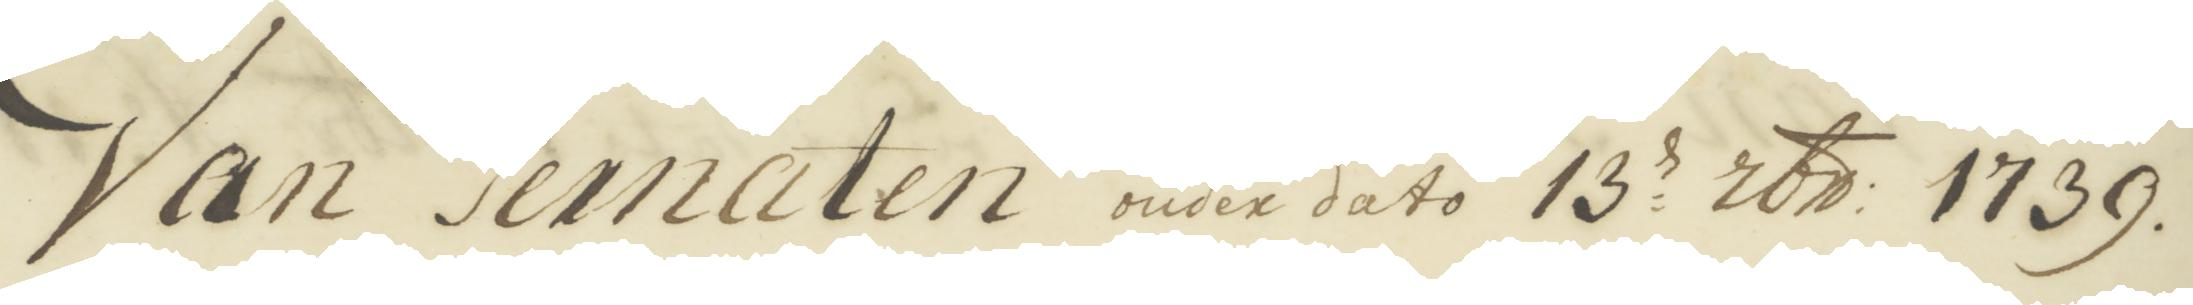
Van Ternaten onder dato 13=en 7br: 1739.
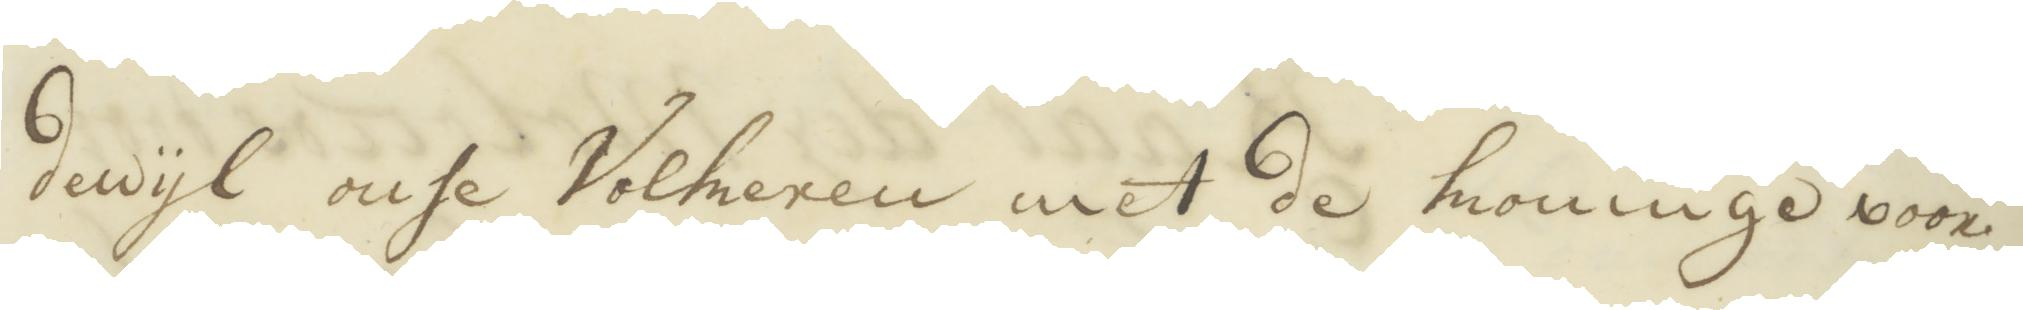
dewijl onse volkeren met de koninge voor
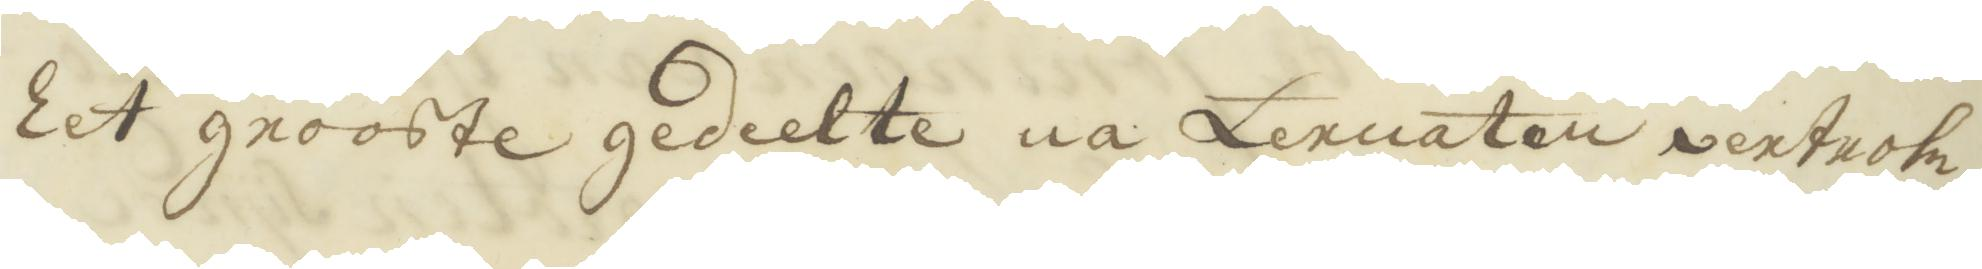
het grooste gedeelte na ternaten vertrok
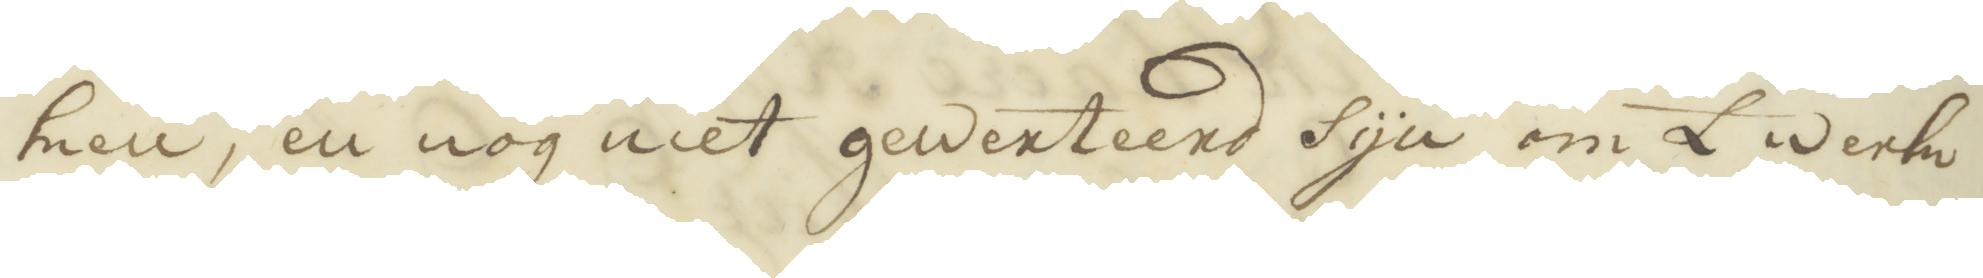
ken, en nog niet gewerteerd sijn om 't werk
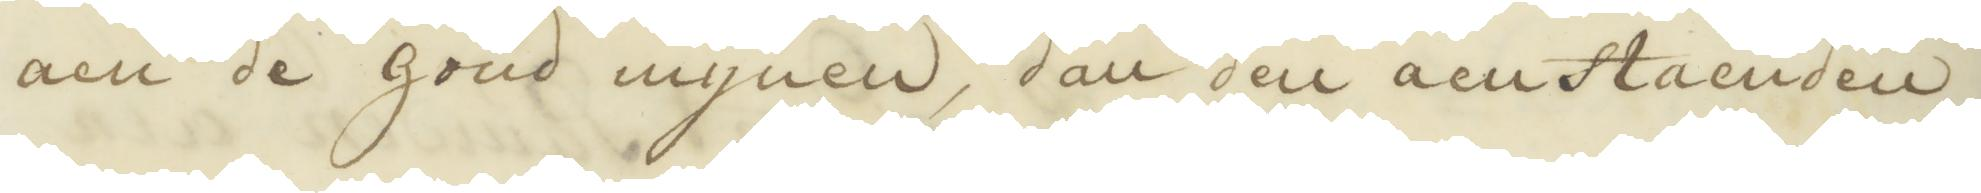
aen de goud mijnen, dan den aenstaenden
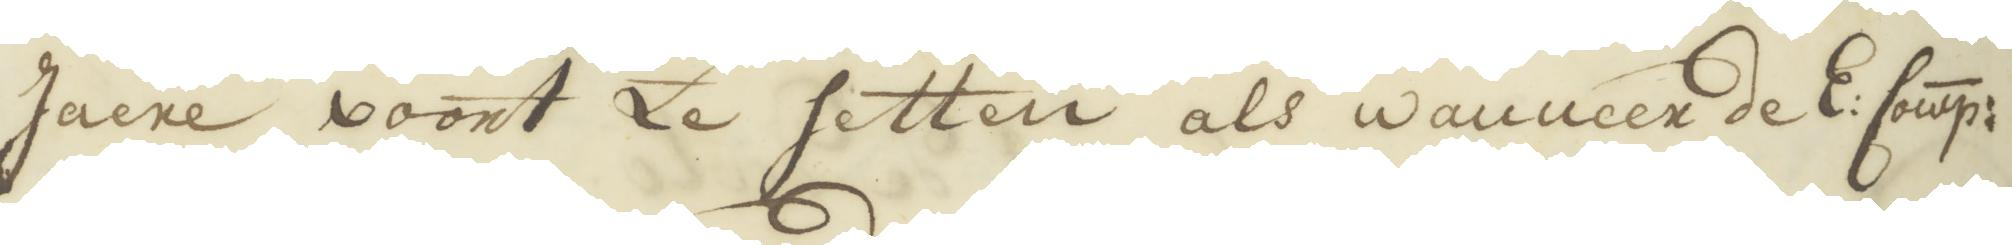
Jaere voort te setten als wanneer de E: Comp:
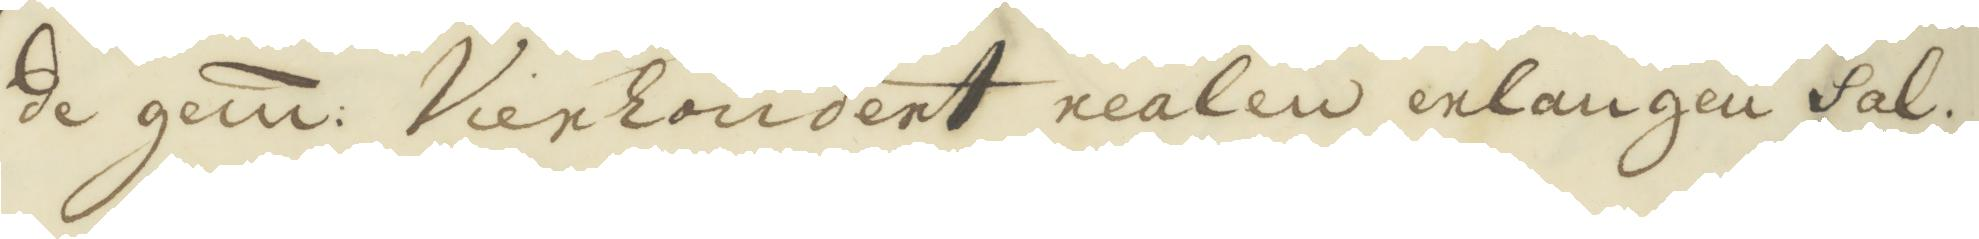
de gem: Vierhondert realen erlangen sal.
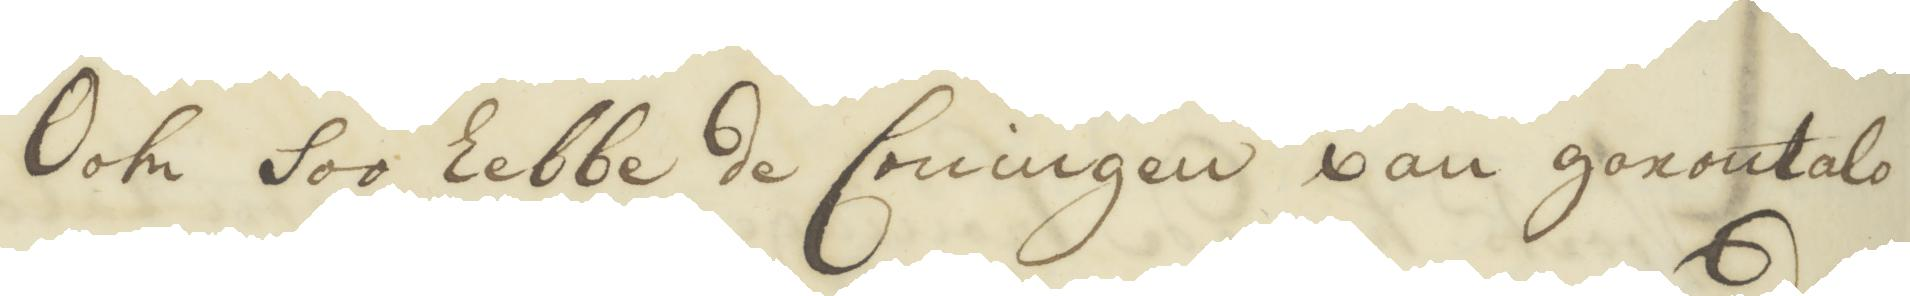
Ook soo hebbe de Coningen van gorontalo
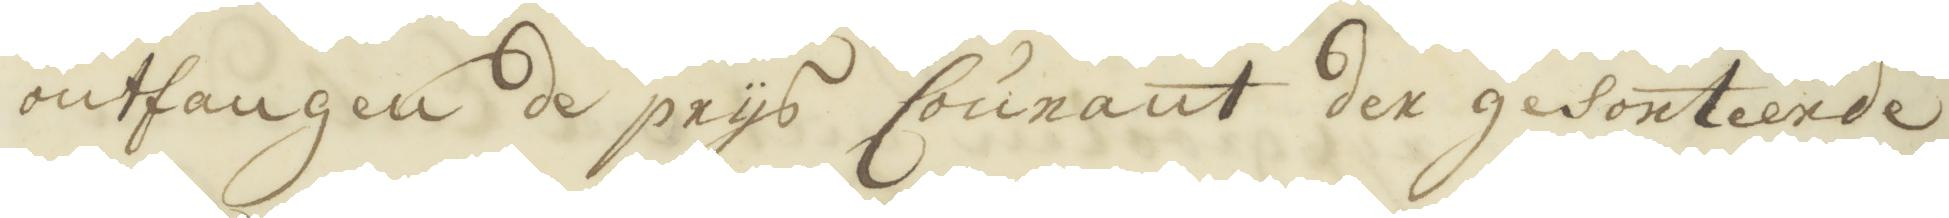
ontfangen de prijs Courant der gesorteerde
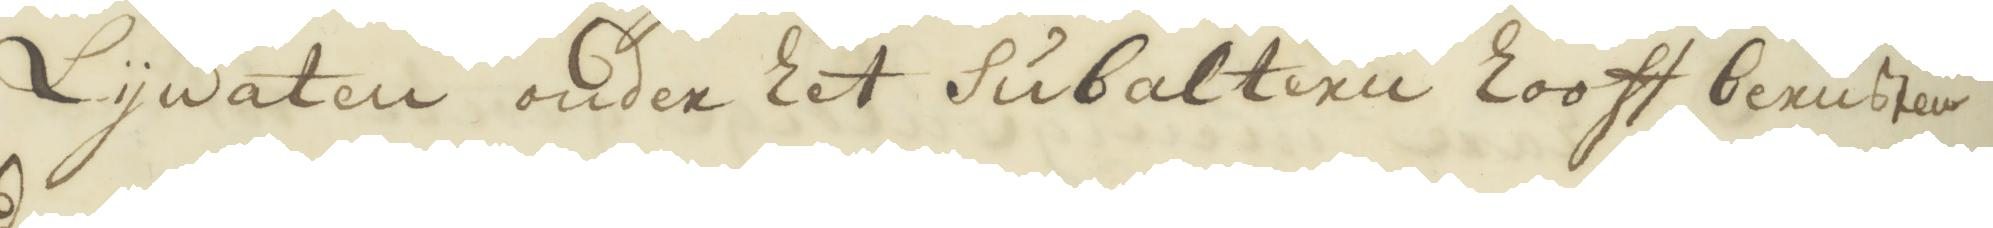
Lijwaten onder het subaltern hooft berusten
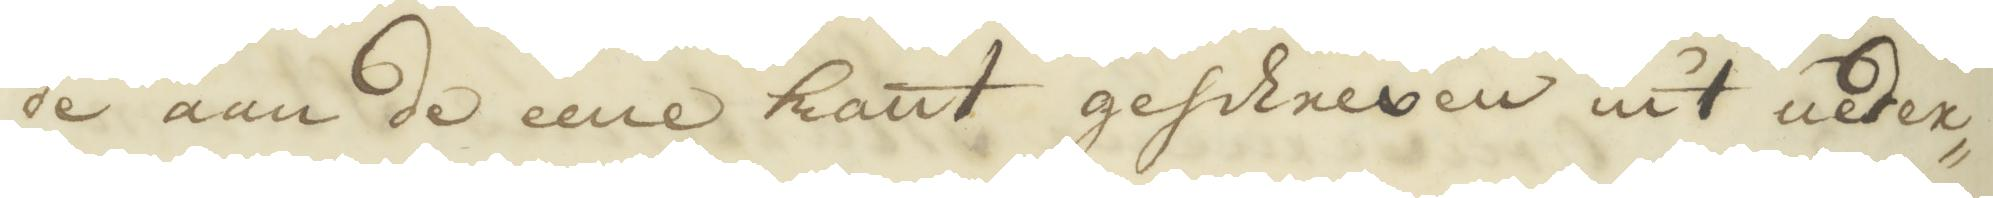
de aan de eene kant geschreven in’t neder„
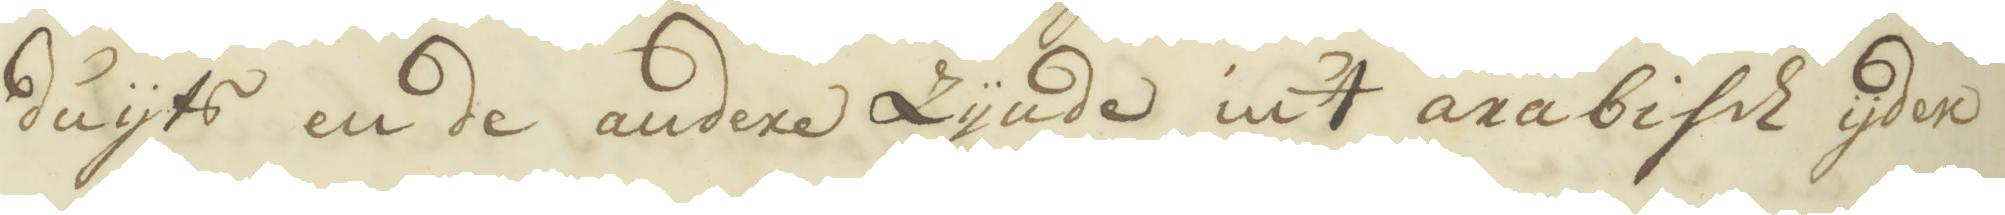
duijts en de andere zijnde in ’t arabisch ijder
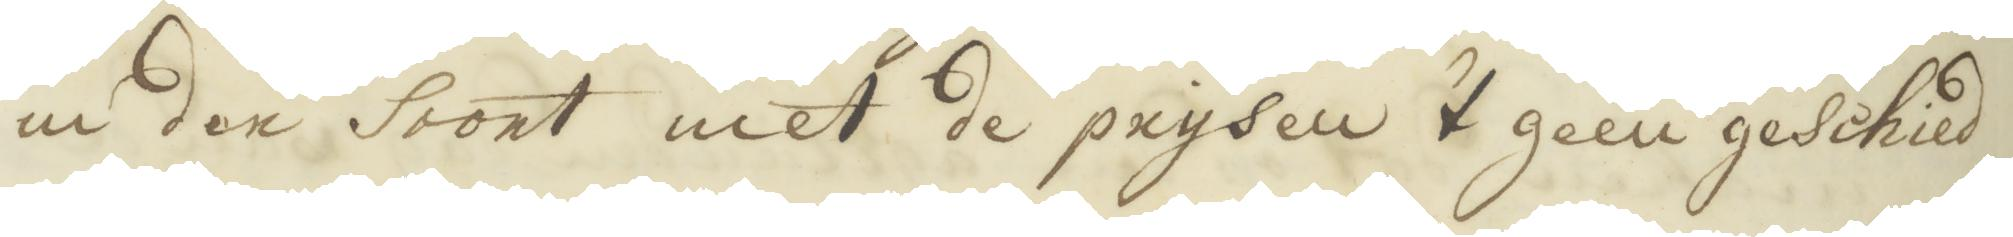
in der soort met de prijsen ’t geen geschied
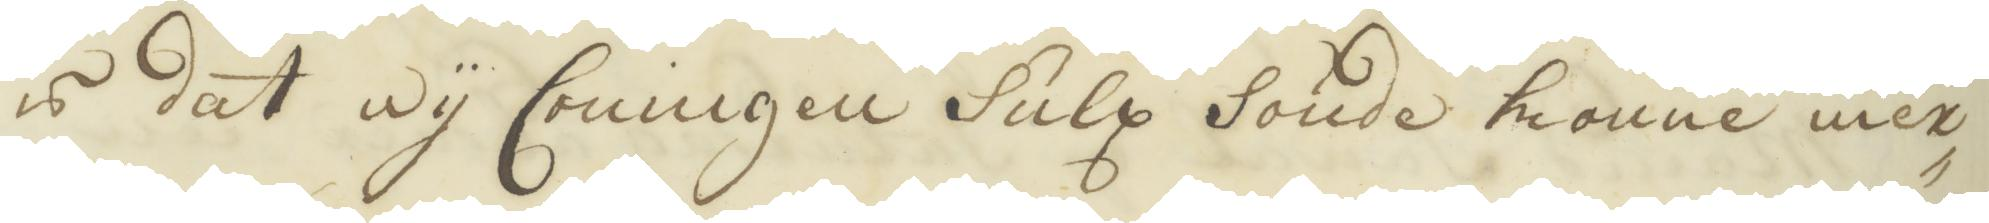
is dat wij Coningen sulx soude konne mer„
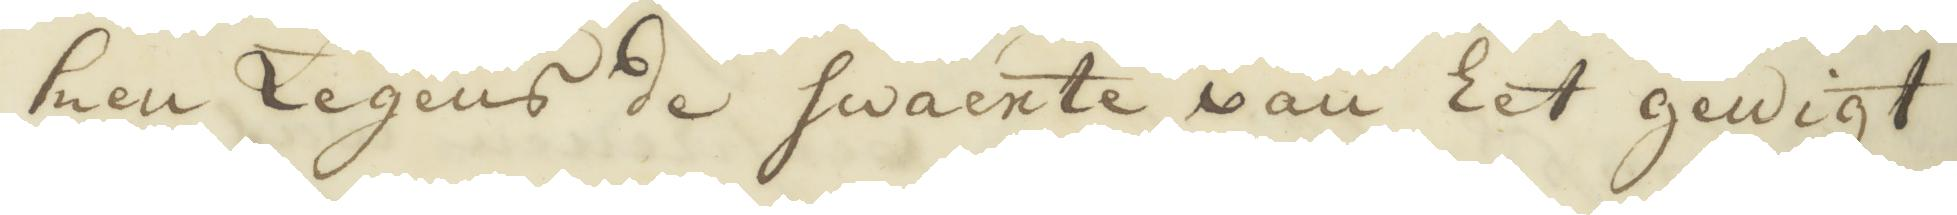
ken tegens de swaerte van het gewigt
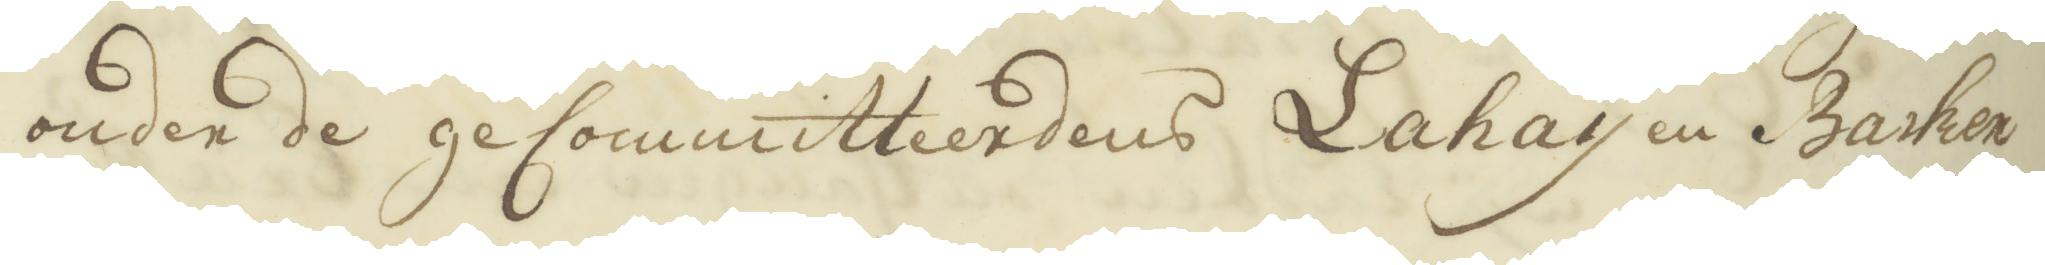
onder de gecommitteerdens Lahaij en Barker
